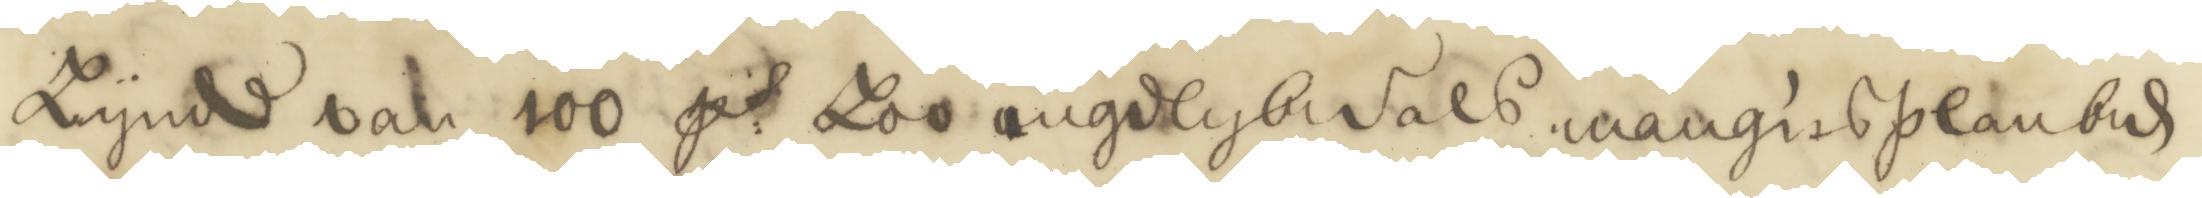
Zijnde van 100 p:s Zoo ongelyke als mangus planken
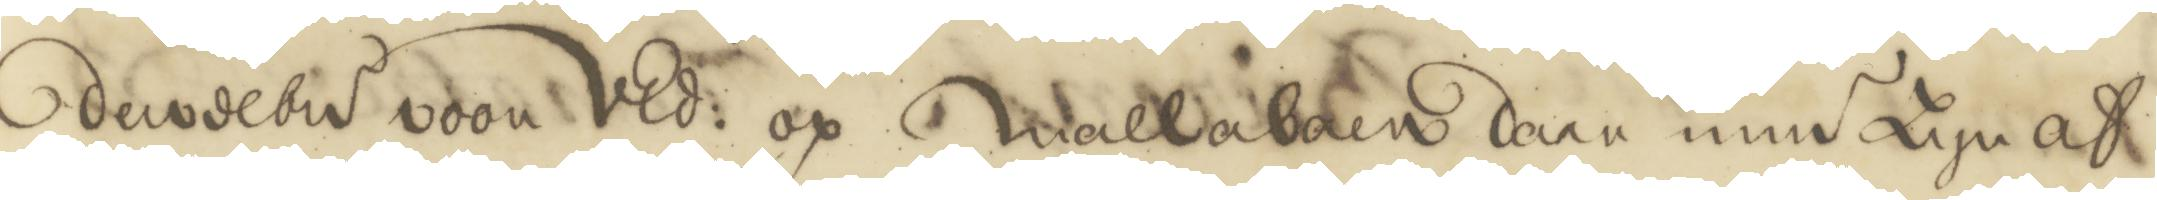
dewelke voor VEd: op mallabaer daer inne Zyn af
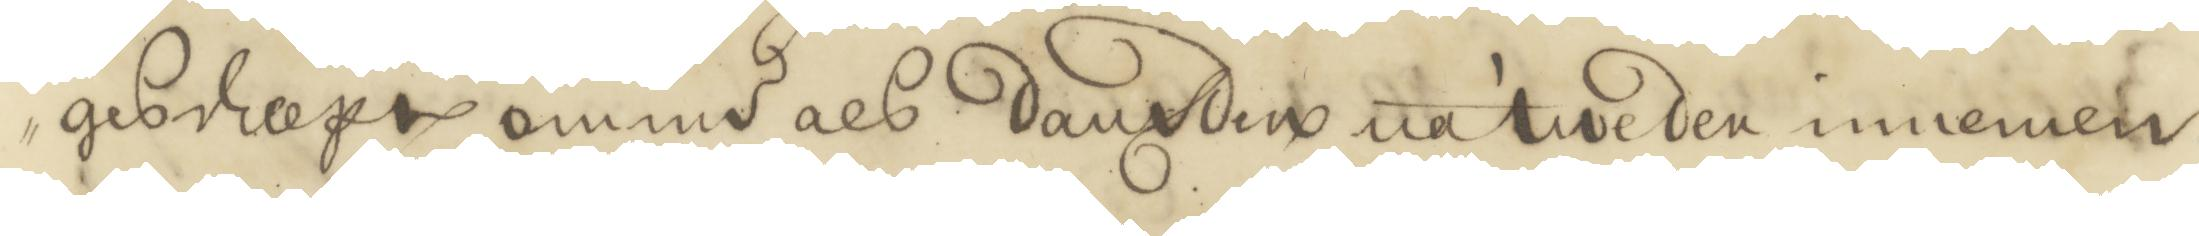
„gescheept omme als dan verder na 't weder innemen
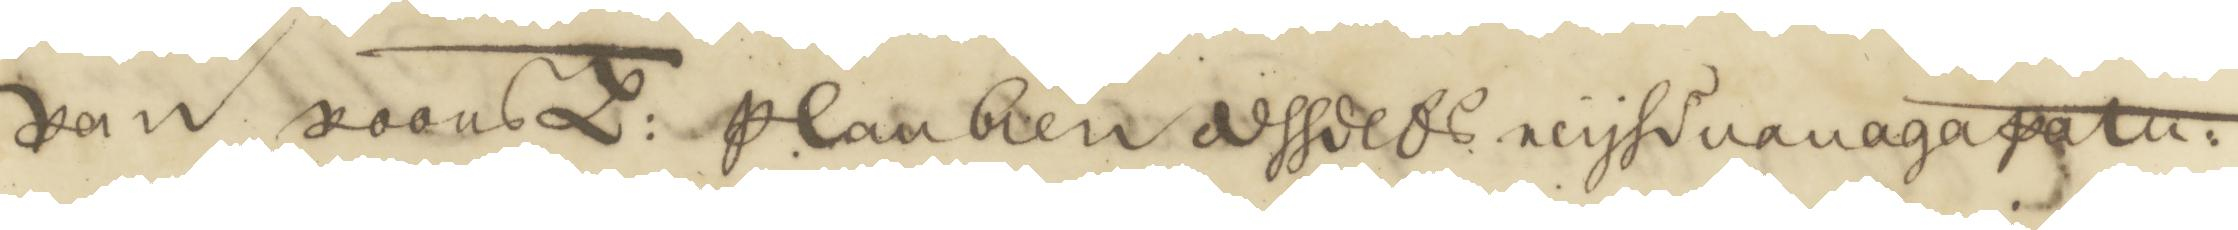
van voorsZ: planken desselfs reijse na nagapatn:
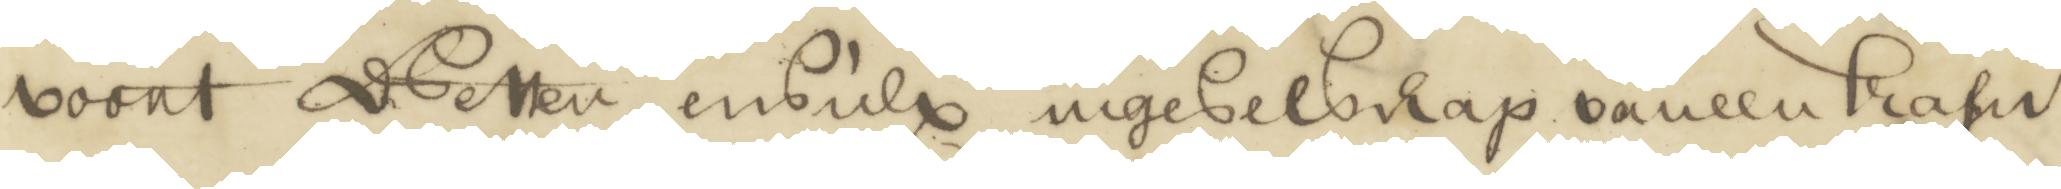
voort te setten en sulx ingeselschap van een kasie
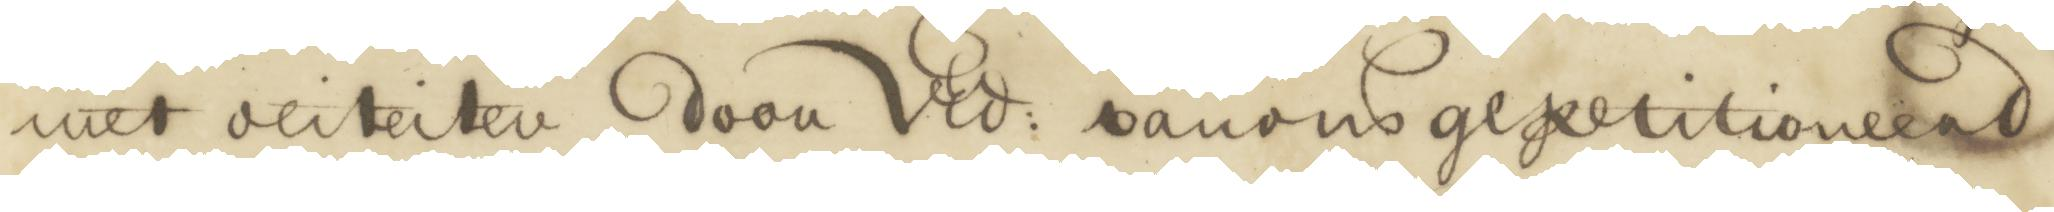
met oliteiten door VEd: van ons gepetitioneerd
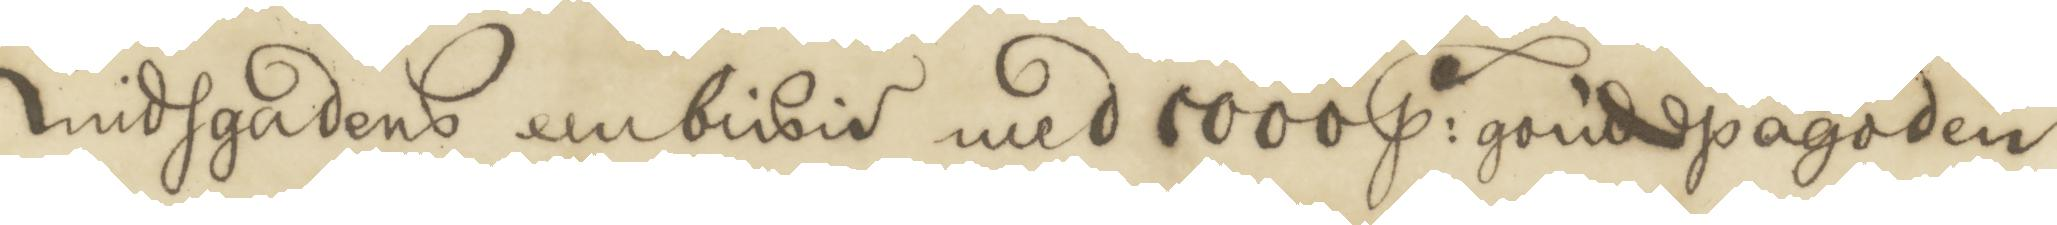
midsgaders een busie med 5000 p:s goude pagoden
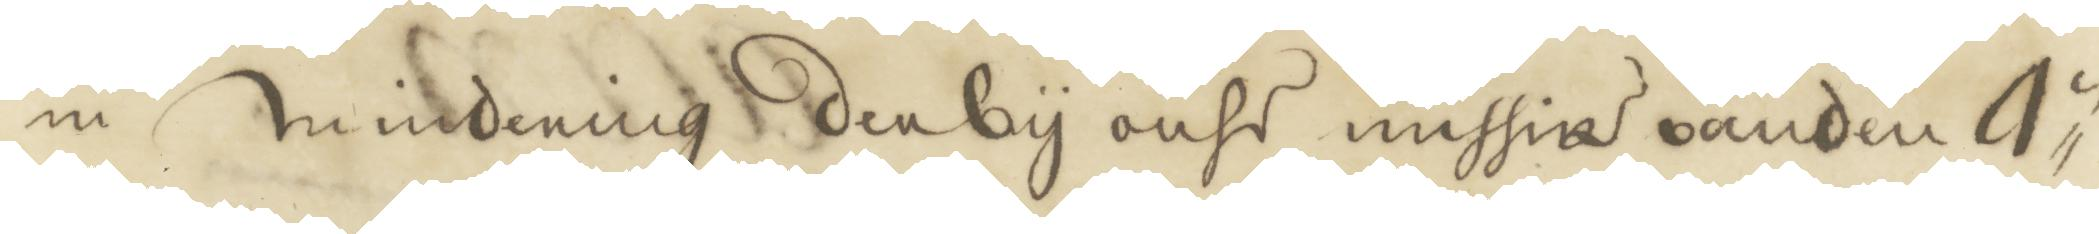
in mindering der bij onse missive van den 4„e
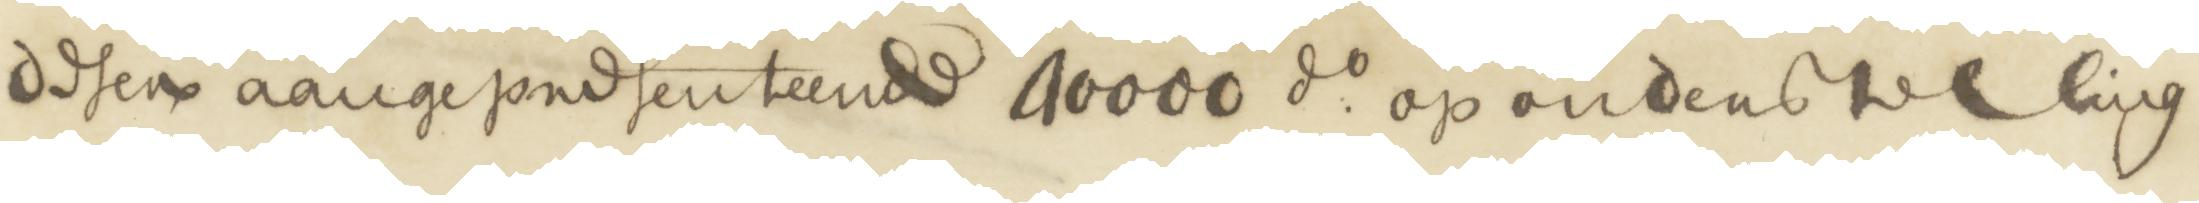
deser aangepresenteerde 40000 d:o op onderstelling
